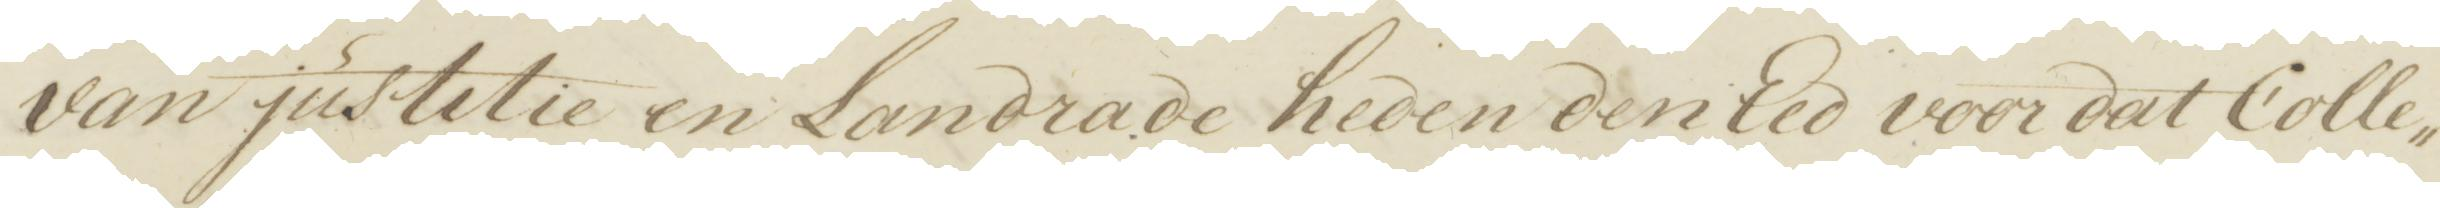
van justitie en landrade heden den Eed voor dat Colle„
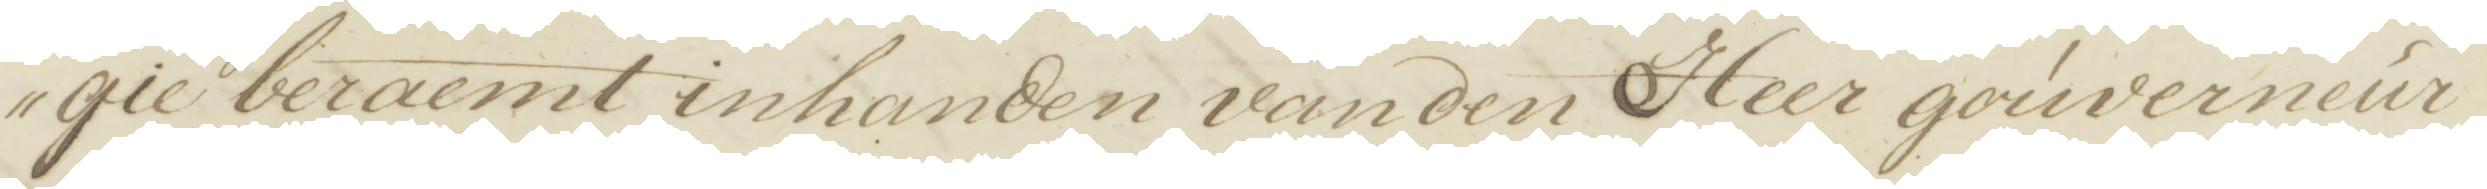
„gie beraemt inhanden van den Heer gouverneur
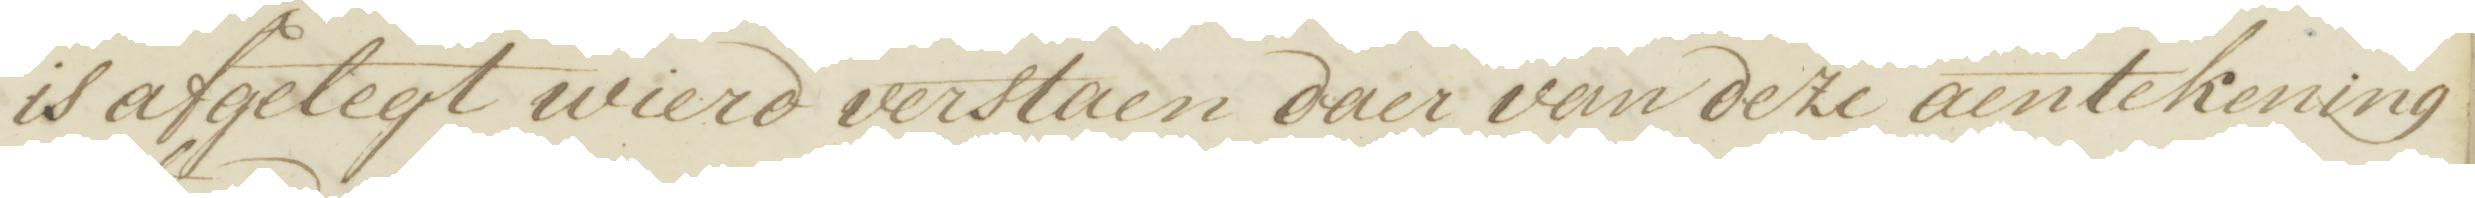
is afgelegt wierd verstaen daer van deze aentekening
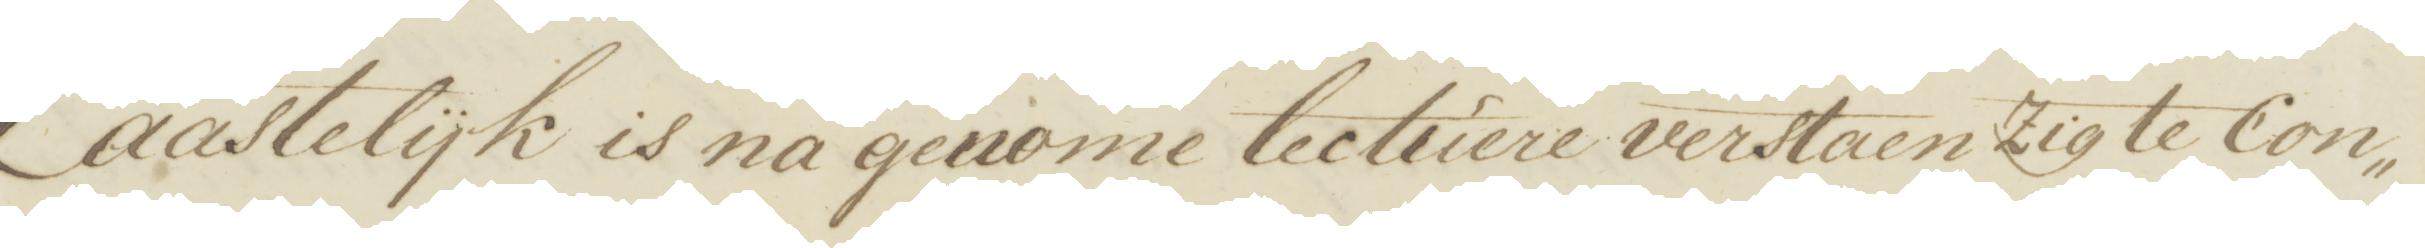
Laastelijk is na genome lectuere verstaen zig te Con„
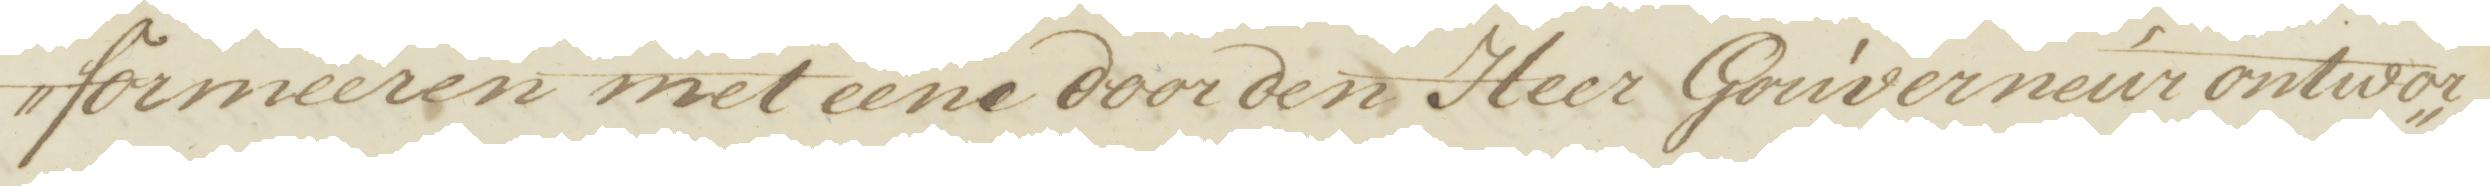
„formeeren met eene door den Heer Gouverneur ontwor„
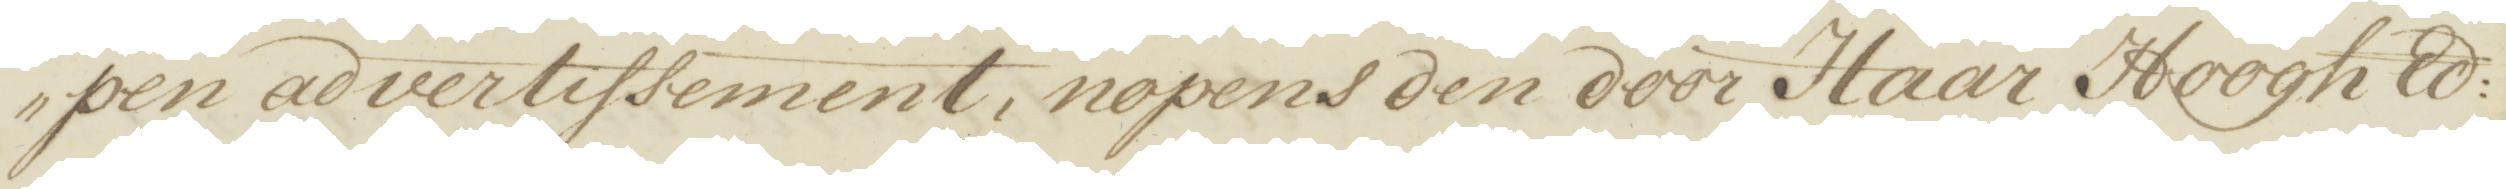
„pen advertissement, nopens den door Haar Hoogh Ed:
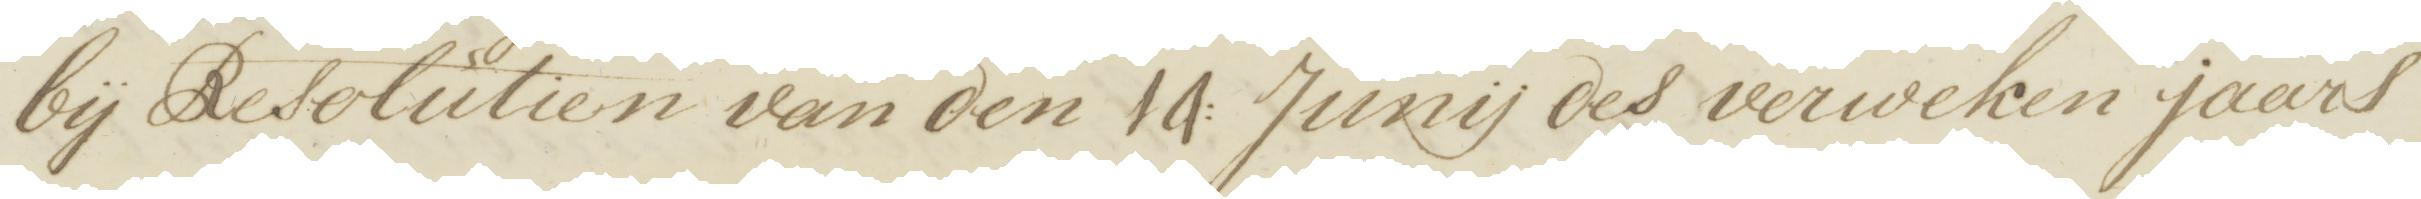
bij Resolutien van den 14: Junij des verweken jaars
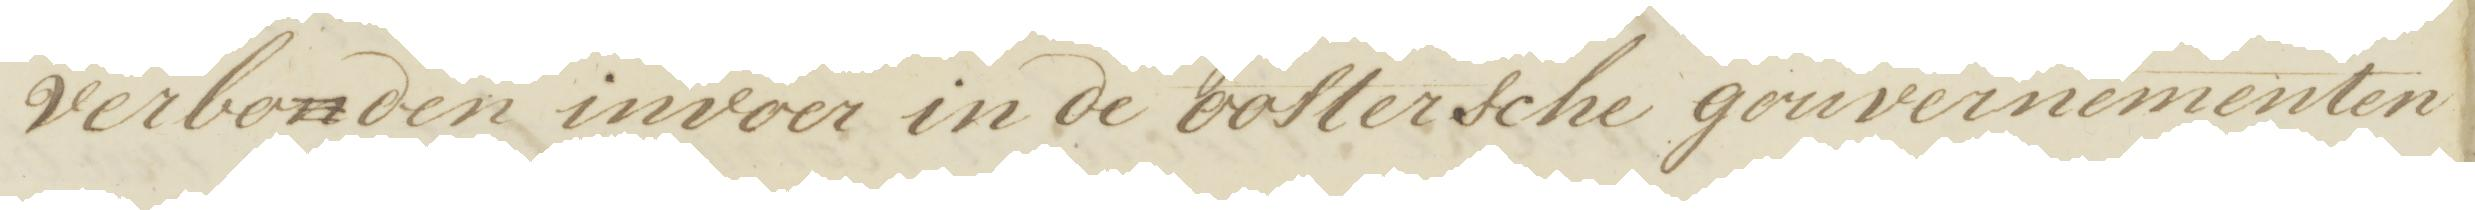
verbonden invoer in de oostersche gouvernementen
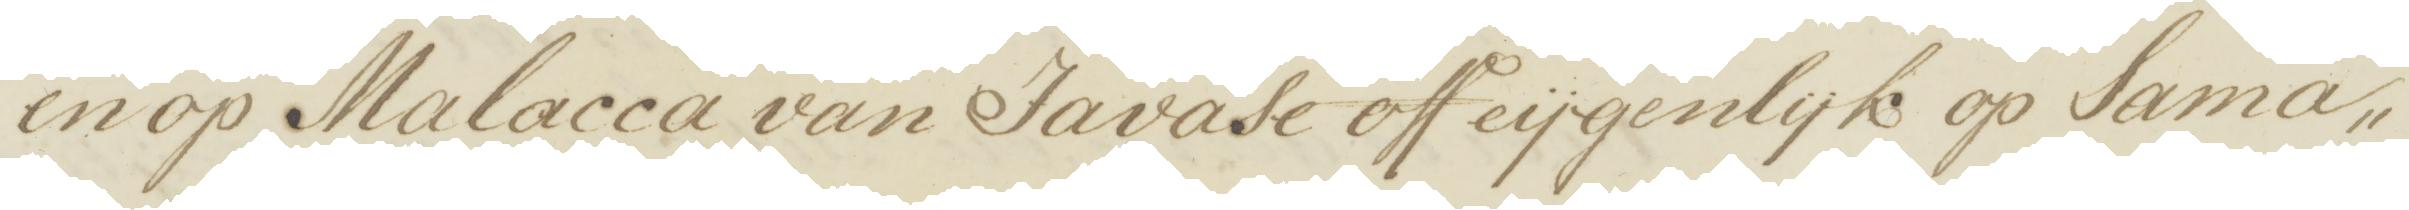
en op Malacca van Javase off eijgenlijk op Sama„
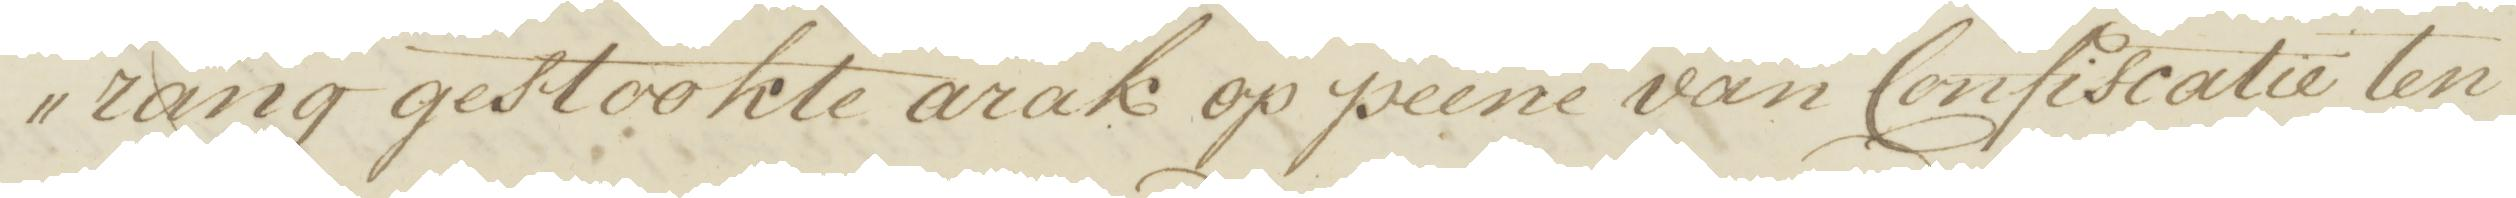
„rang gestookte arak op peene van Confiscatie ten
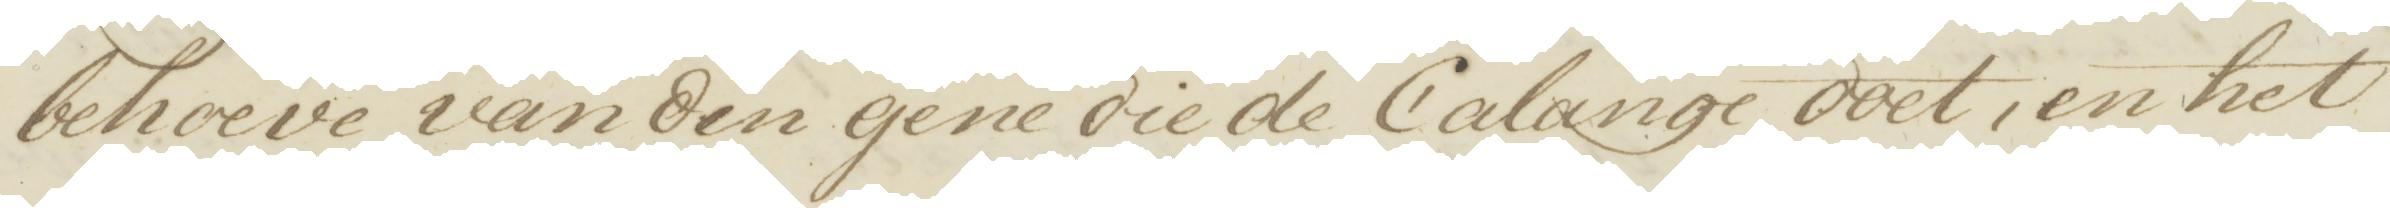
behoeve van den gene die de Calange doet, en het
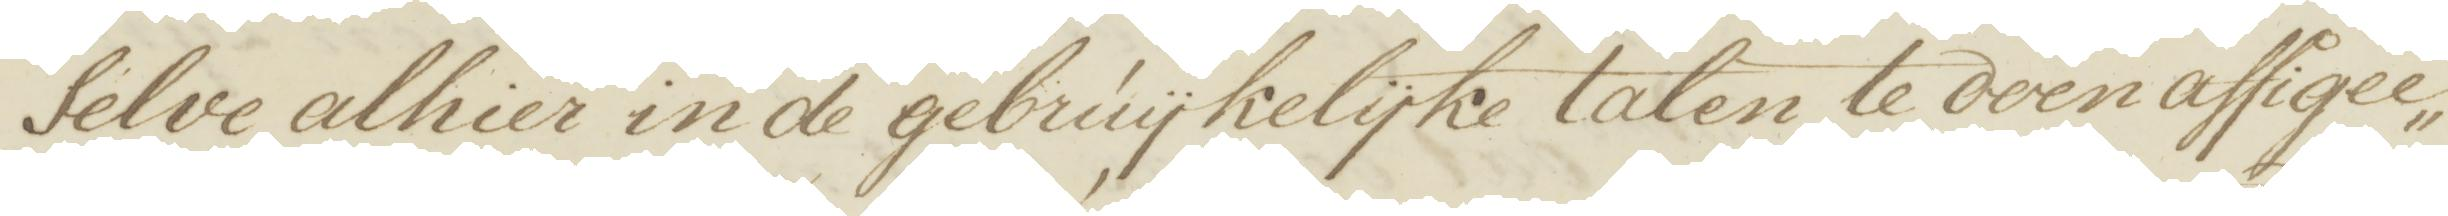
Selve alhier in de gebruijkelijke talen te doen affigee„
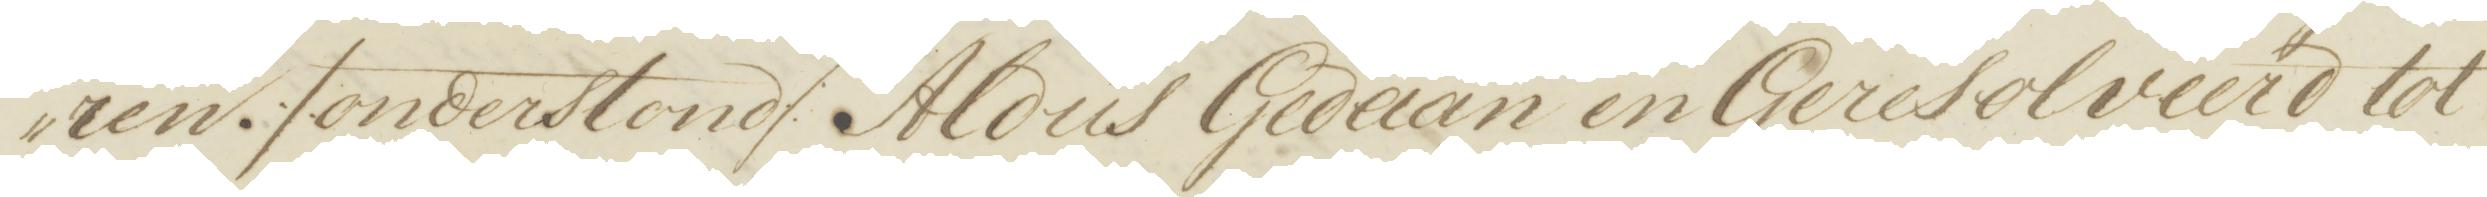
„ren. / onderstond/ Aldus Gedaan en Geresolveerd tot
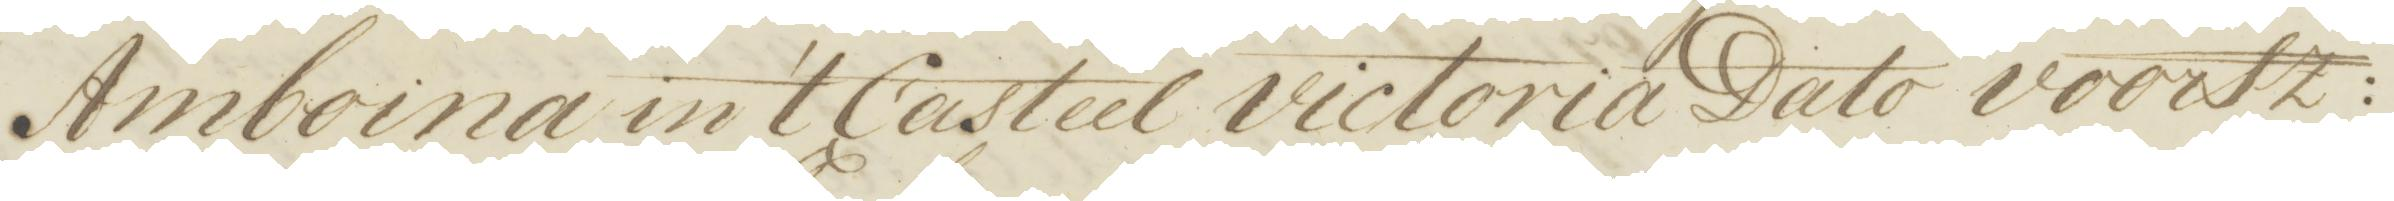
Amboina in ’t Casteel victoria Dato voorsz:
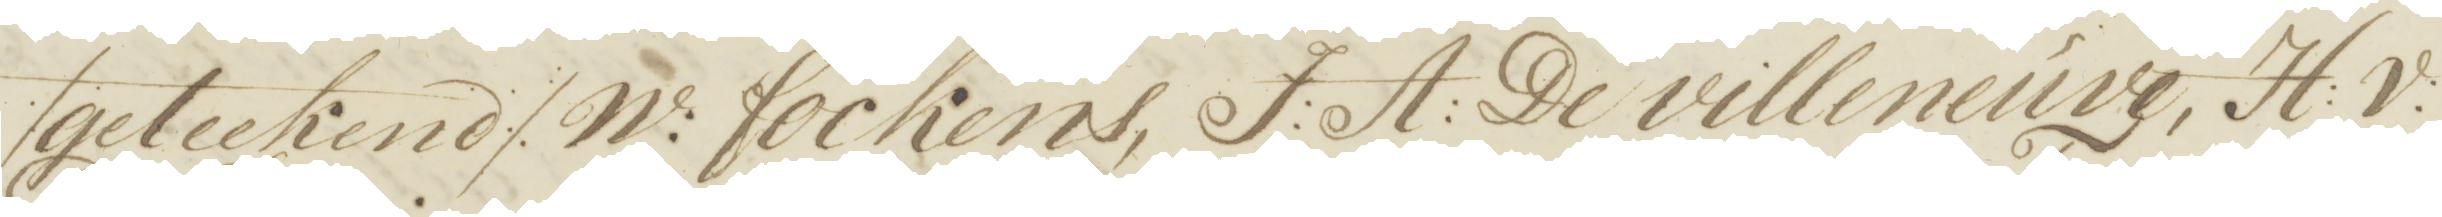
/geteekend:/ W: fockens, J: A: De villeneuve, H: v:
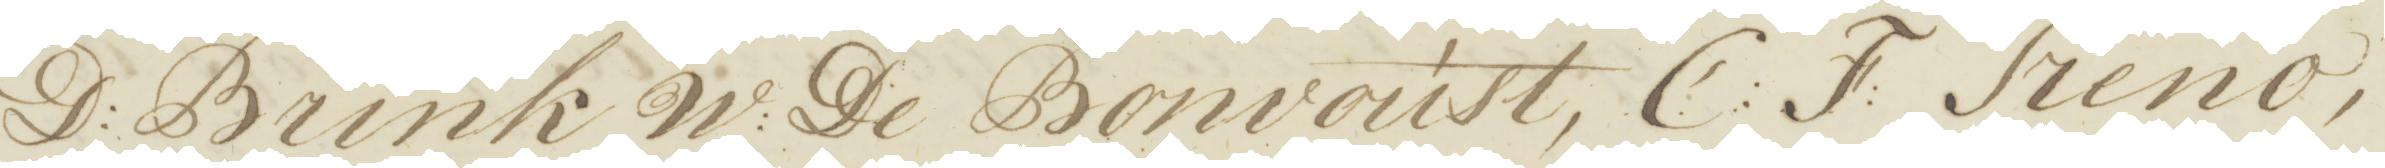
D: Brink W: De Bonvoust, C: F: Treno,
